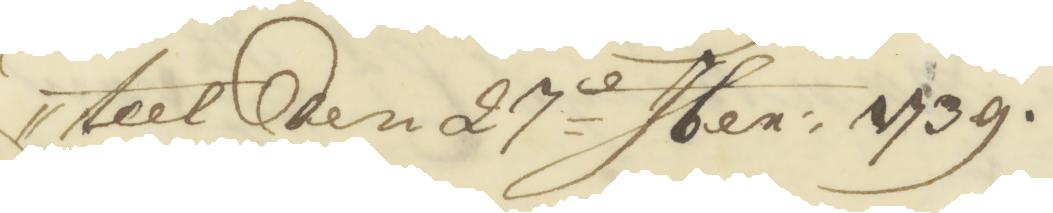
„teel den 27=e 7ber: 1739.
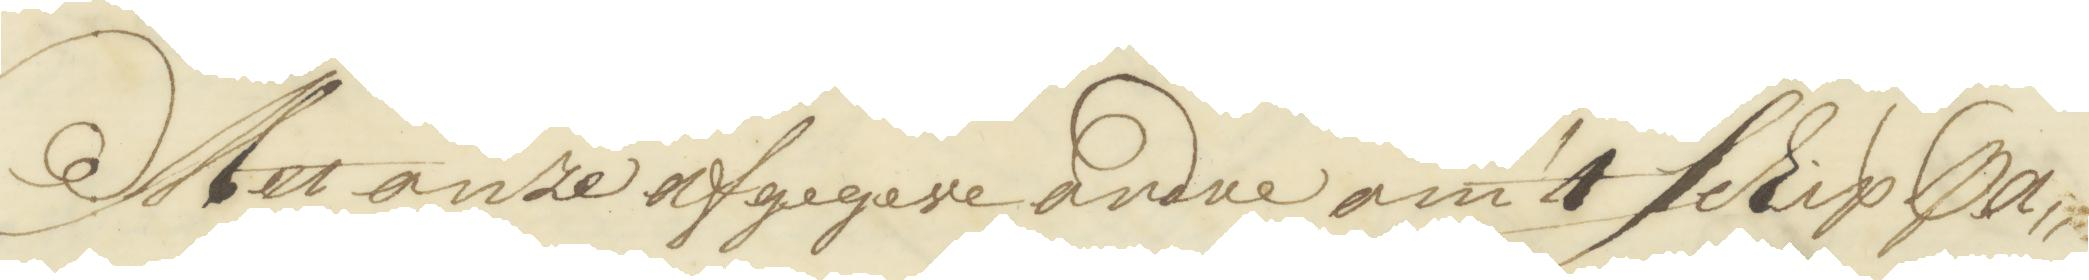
Met onze afgegeve ordre om ’t Schip Pa„
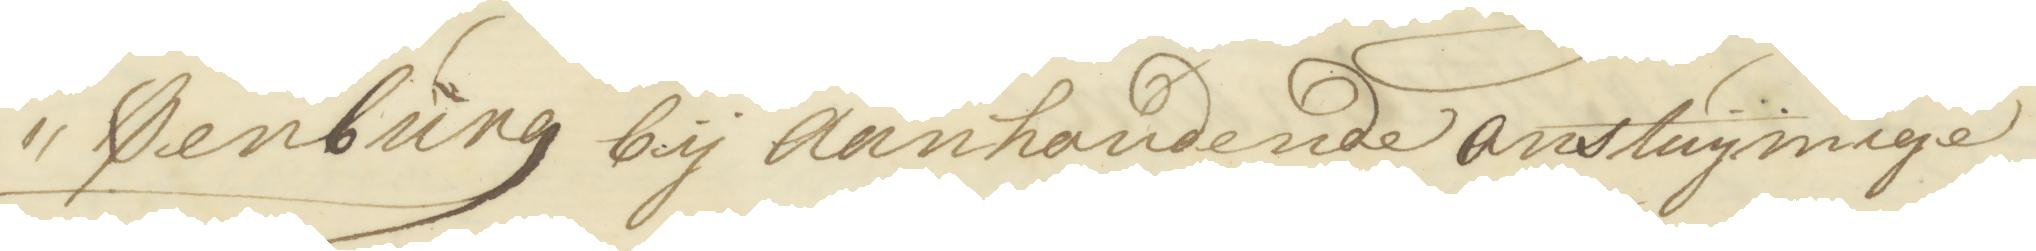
„penburg bij aanhoudende onstuijmige
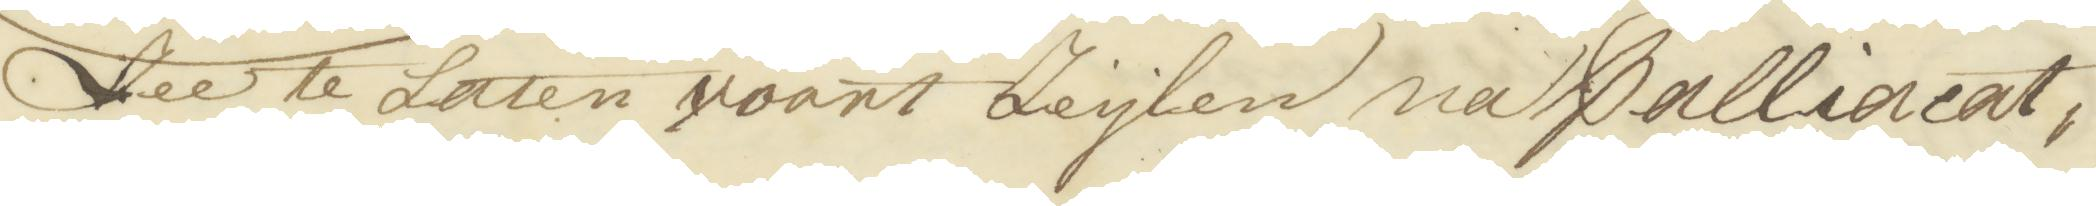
Zee te Laten voort Zeijlen na palliacat„
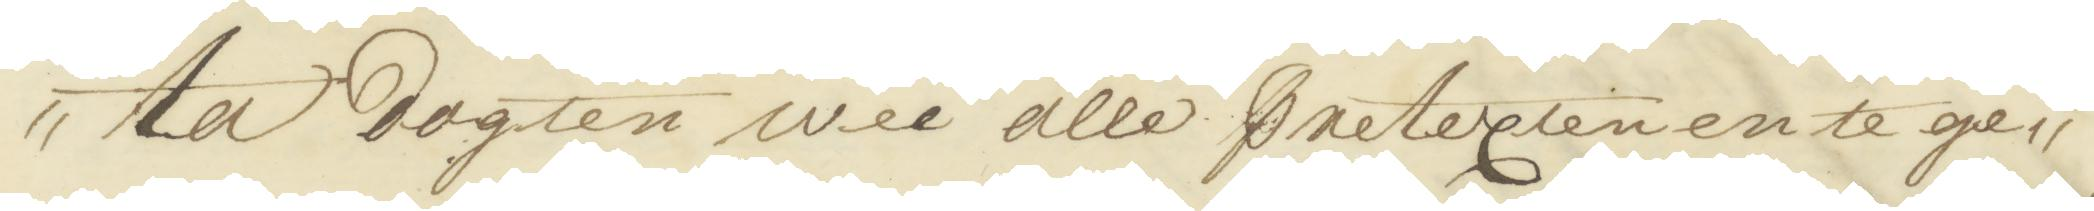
„ta dogten wel alle pretexten en tege„
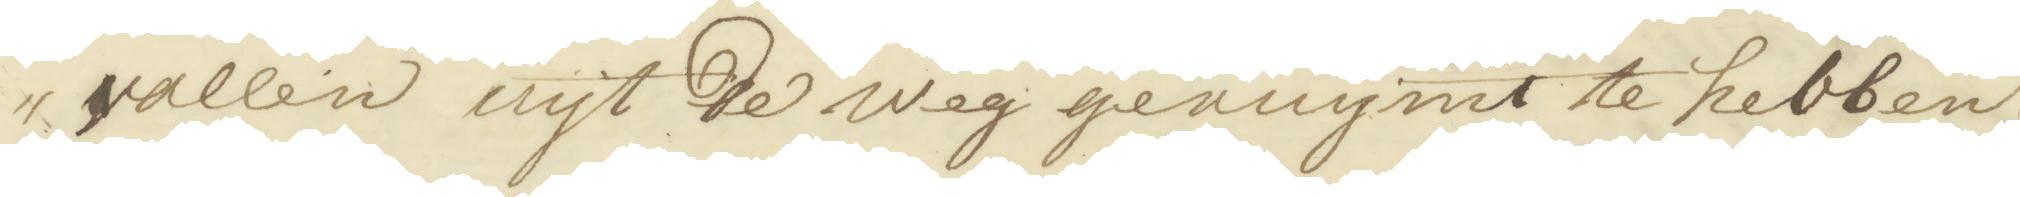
„vallen uijt de weg geruijmt te hebben,
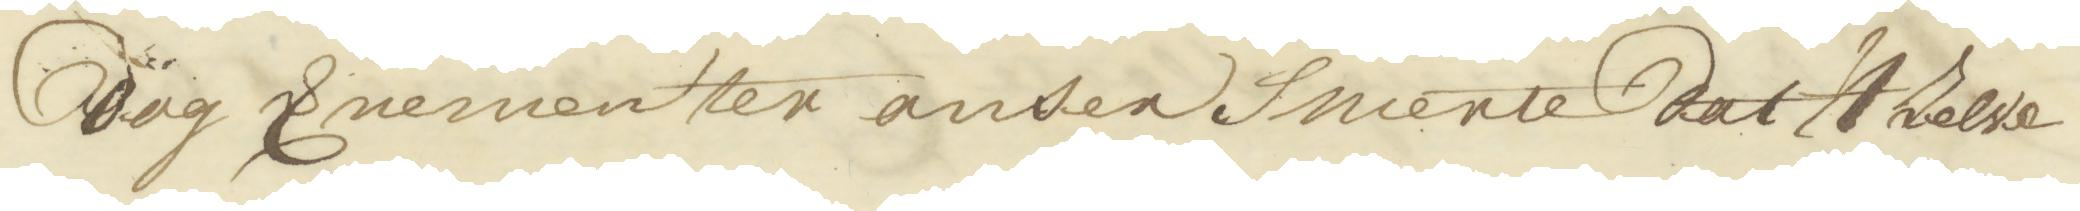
dog vernemen ter onser Smerte dat 't zelve
